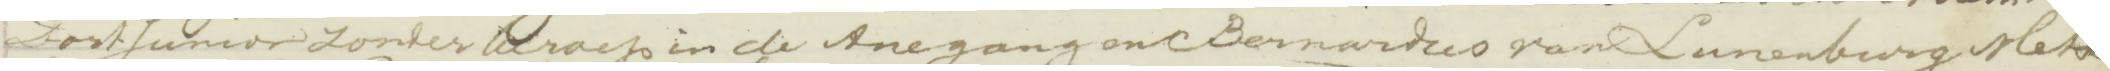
Dort Junior zonder deroep in de Anegang en Bernardus van Lunenburg Mets
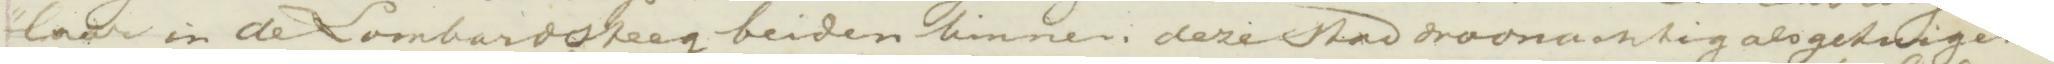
„laar in de Lombardsteeg beiden binnen, deze Stad woonachtig als getuigen
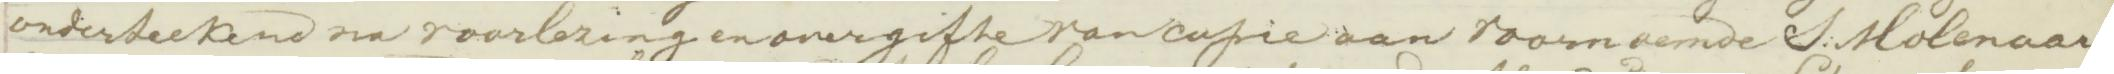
onderteekend na voorlezing en overgifte van copie aan voornoemde S: Molenaar
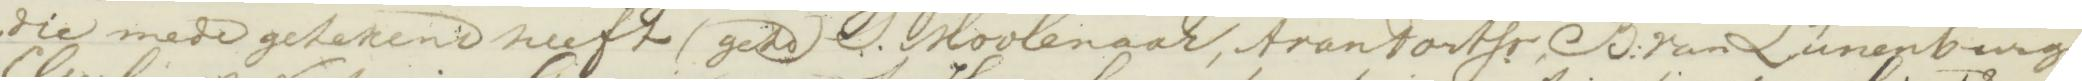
die mede getekend heeft (getd) S. Moolenaar, Arandorthr, B: van Lunenburg
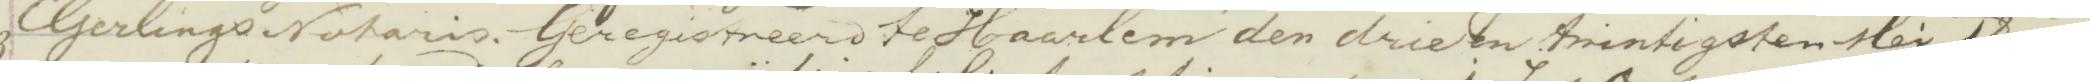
C Gerlings Notaris. Geregistreerd te Haarlem den drie en twintigsten Mei 1800
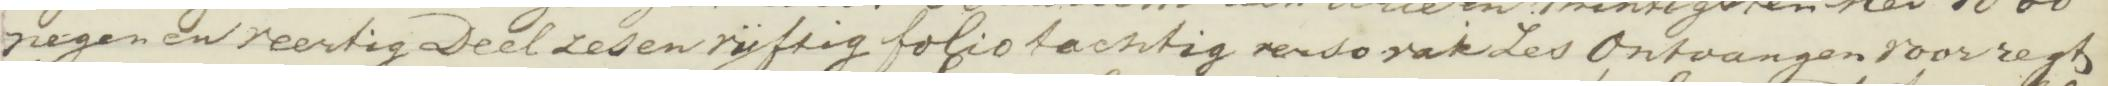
negen en veertig Deel zes en vijftig folio tachtig verso vak Zes ontvangen voor regt
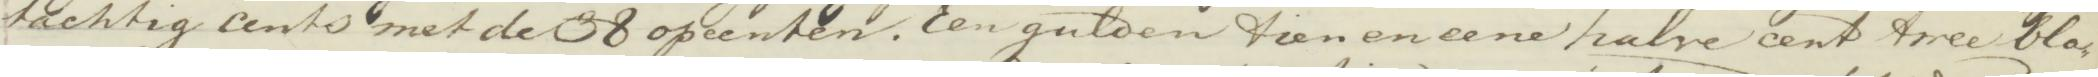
tachtig cents met de 38 opcenten, Een gulden tien en eene halve cent twee bla„
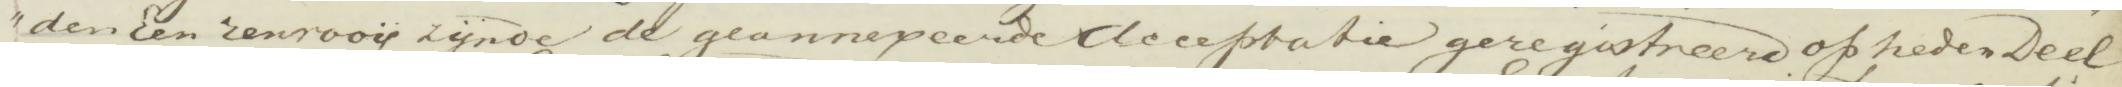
„den Een renvooij zijnde de geannexeerde Acceptatie geregistreerd op heden Deel
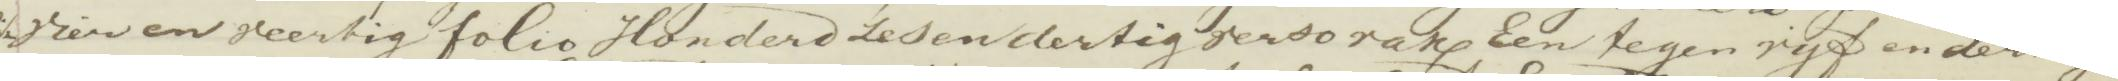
Vier en veertig folio Honderd zes en dertig verso vak Een tegen vyf en dertig
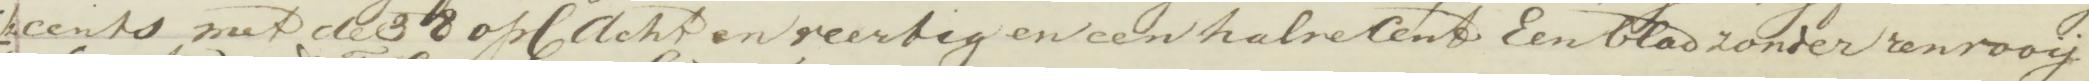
cents met de 38 opC acht en veertig en een halve Cent Een blad zonder renvooij
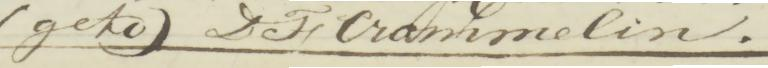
(getd) D:F: Crommelin.
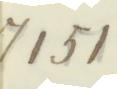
7151
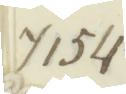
7154
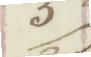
5/21
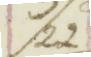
5/22
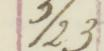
5/23
